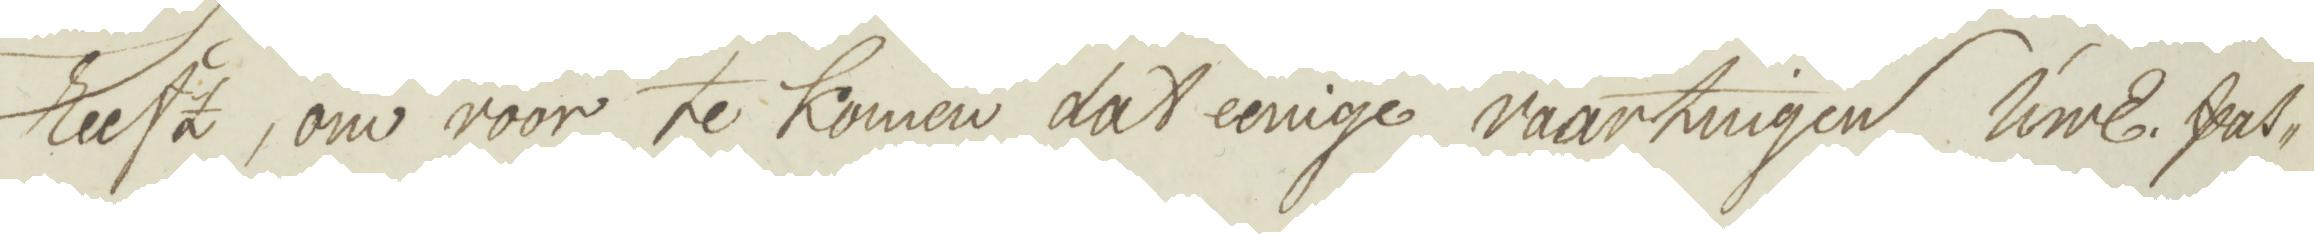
heeft, om voor te komen dat eenige vaartuigen UwE. pas„
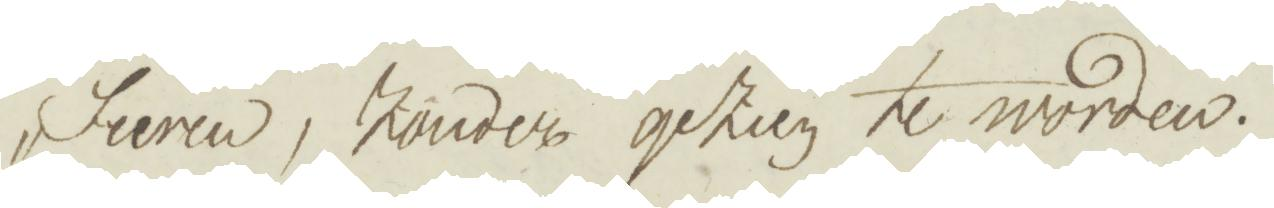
„Seeren, zonder gezien te worden.
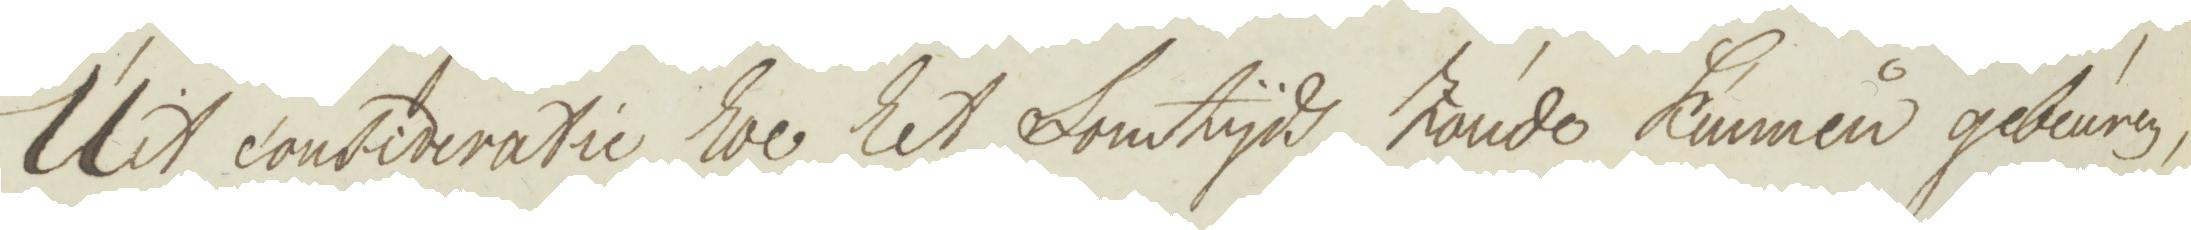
Uit consideratie hoe het Somtijds Zoude kunnen gebeuren,
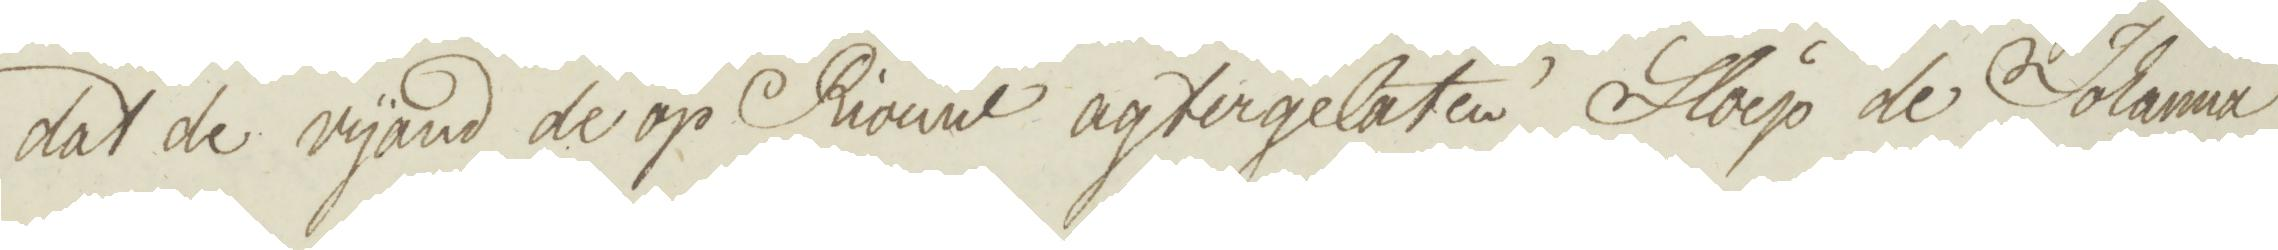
dat de vijand de op Riouw agtergelaten Sloep de Iohanna
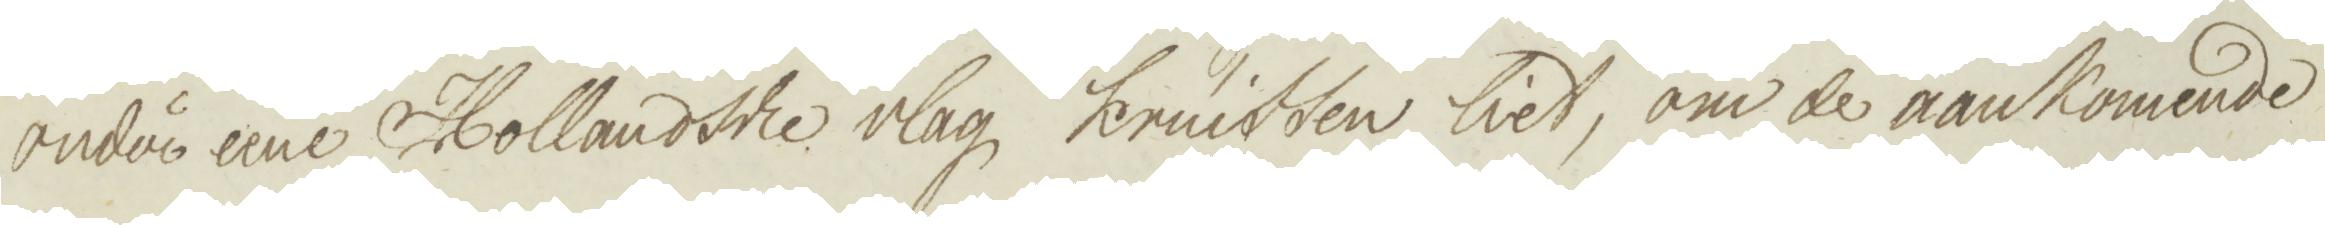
onder eene Hollandsche vlag kruissen liet, om de aankomende
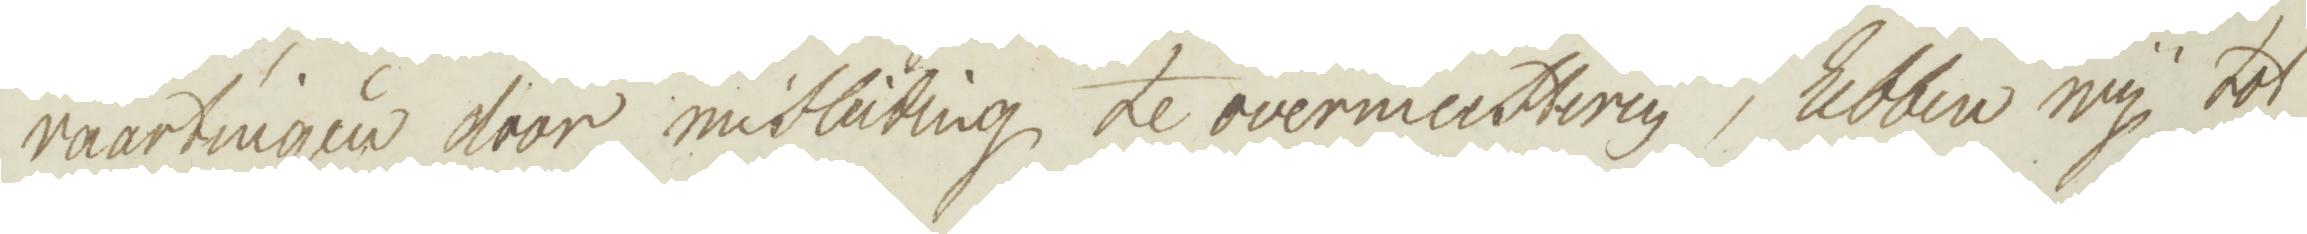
vaartuigen door misleiting te overmeesteren, hebben wij tot
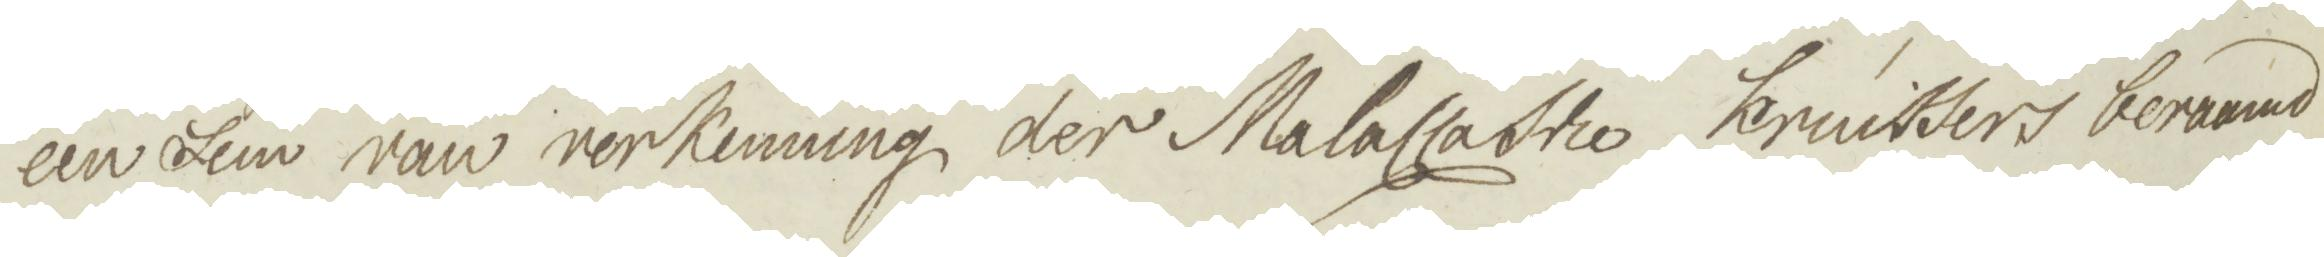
een sein van verkenning der Malaccasche kruissers beraamd
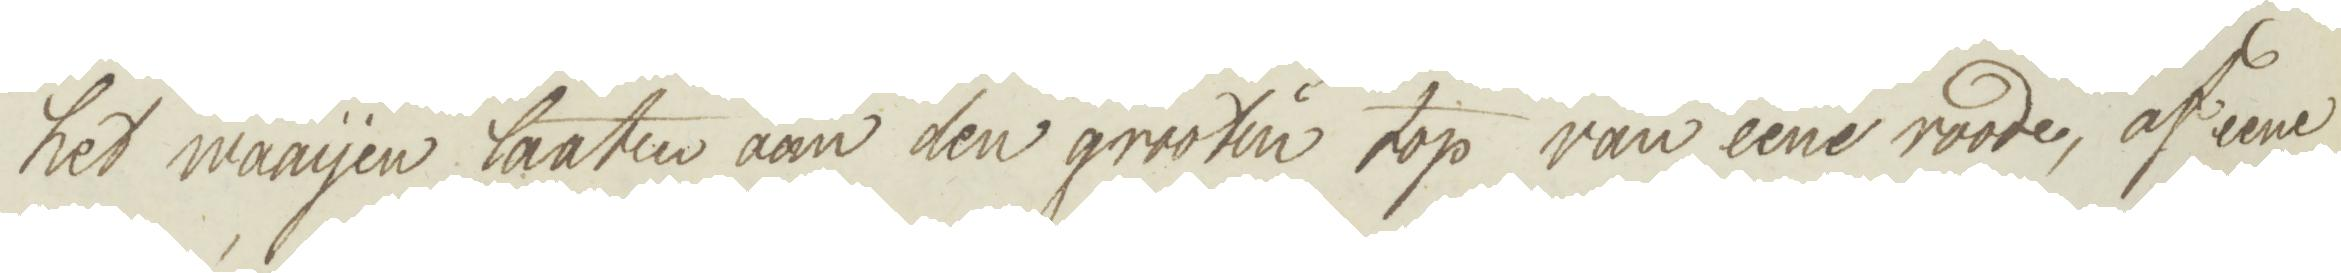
het waaijen laaten aan den grooten top van eene roode, of eene
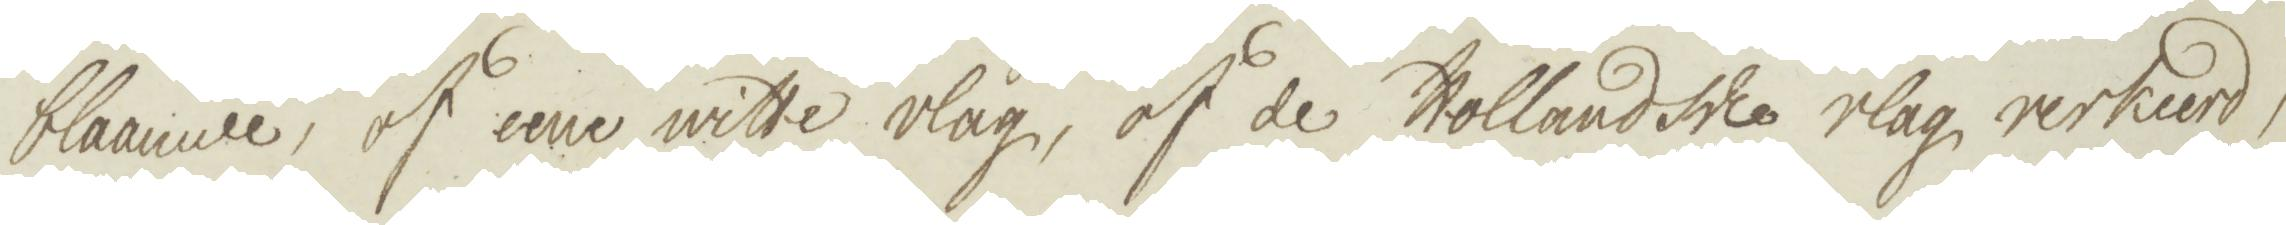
blaauwe, of eene witte vlag, of de Hollandsche vlag verkeerd,
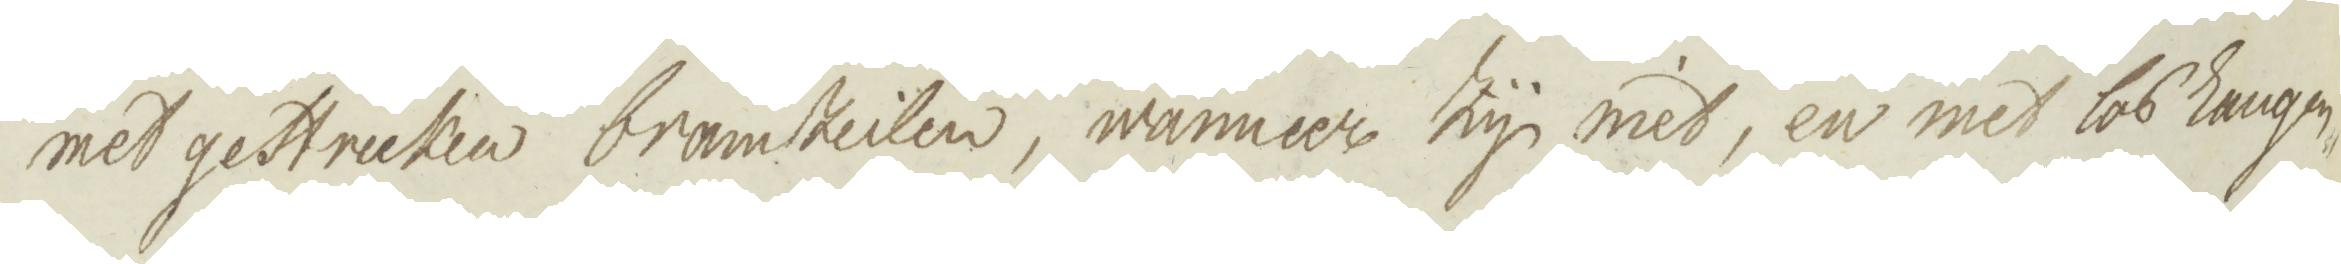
met gestreeken bramzeilen, wanneer zij niet, en met los hangen„
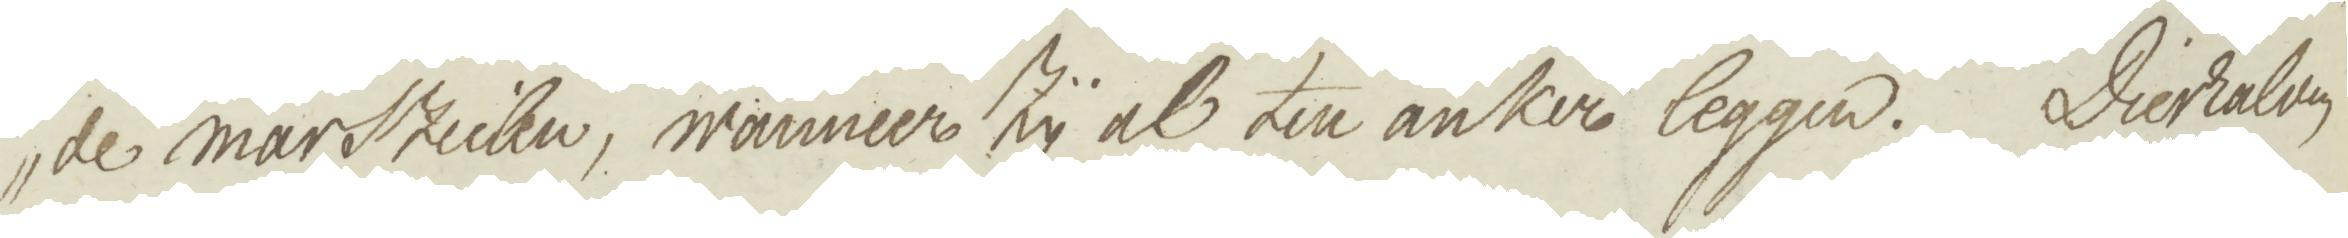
„de marszeilen, wanneer Zij al ten anker leggen. Dierhalven
